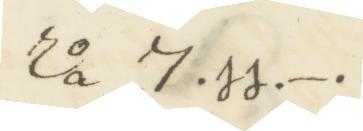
roa 7. 11.—.
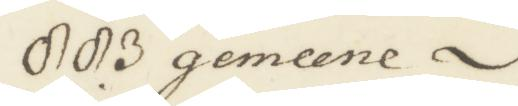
883 gemeene _=os
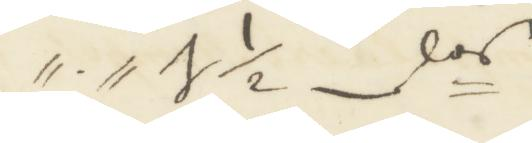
„ . „ 1½ _=os
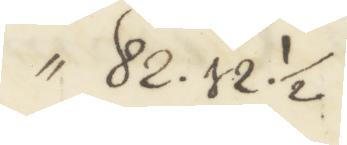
„ 82.12.½
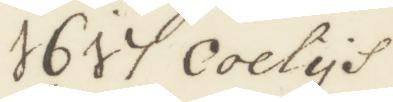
1617 Coelijs
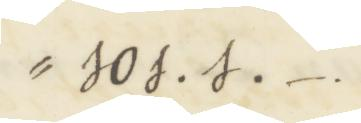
„ 108 . 1 . — .
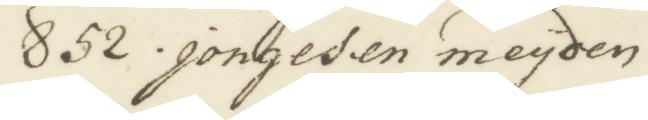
852. jonges en meijden
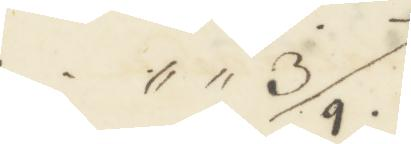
. .„ „ ¾ .
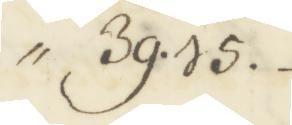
„ 39:75.
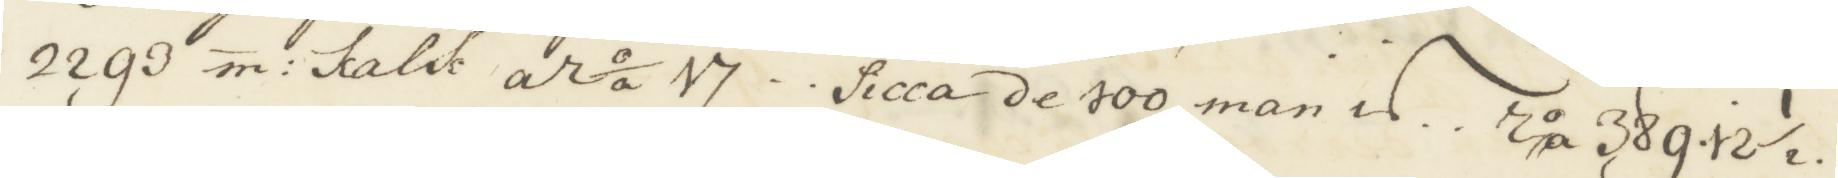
2293 m: kalk a ro/a 17 . . sicca de 100 man is . . r„oa 389.12½
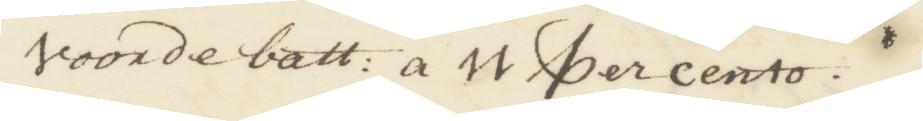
voor de batt: a 11 percento . .
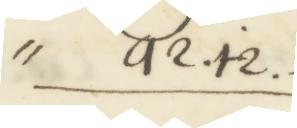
„ 42.12.
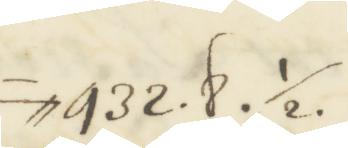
„432.8.½.
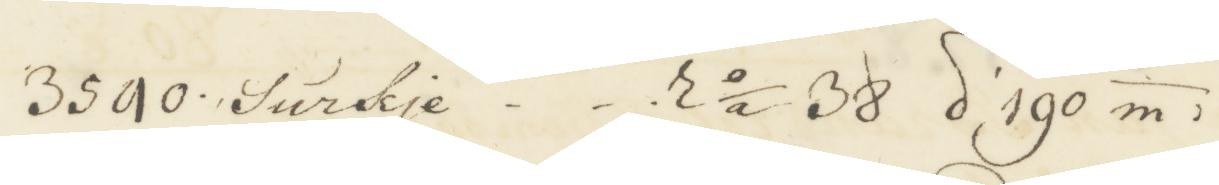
3540 . . surkje - - . ro/a 38 d' 190 m:
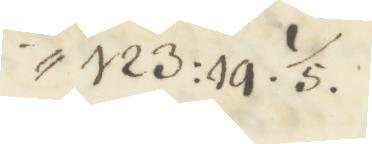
„ 123:19. 1/5.
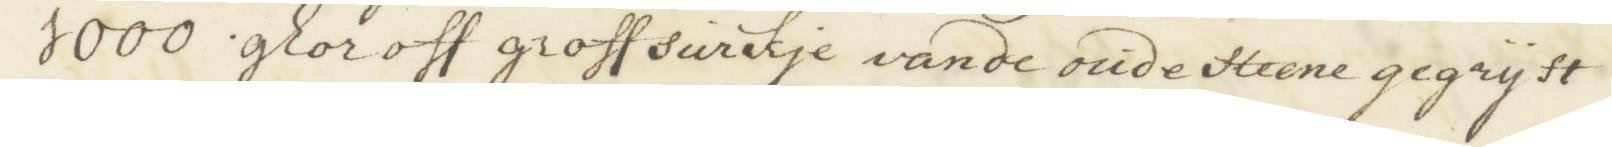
1000. ghor off groff surkje van de oude steene gegrijst
